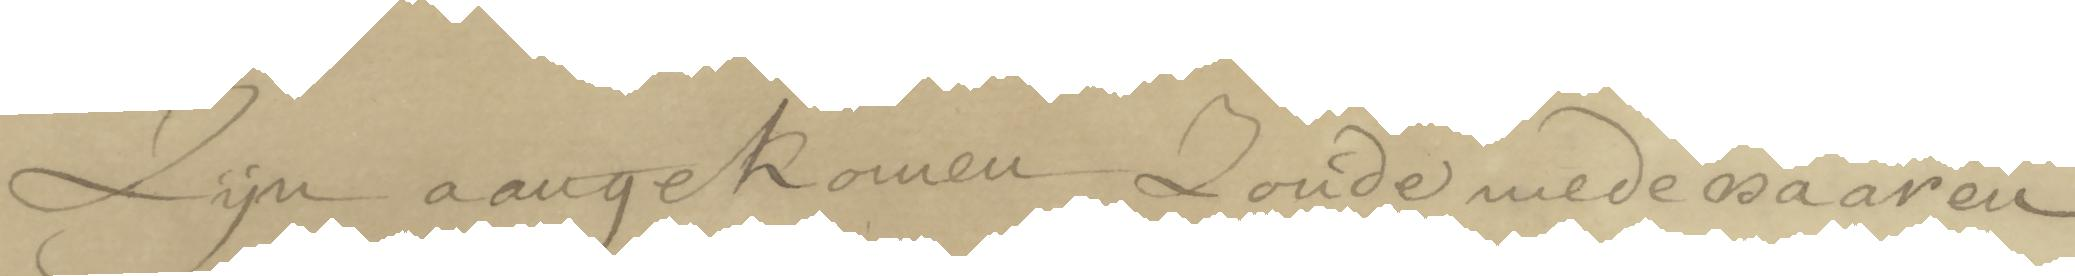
Zijn aangekomen zoude mede vaaren
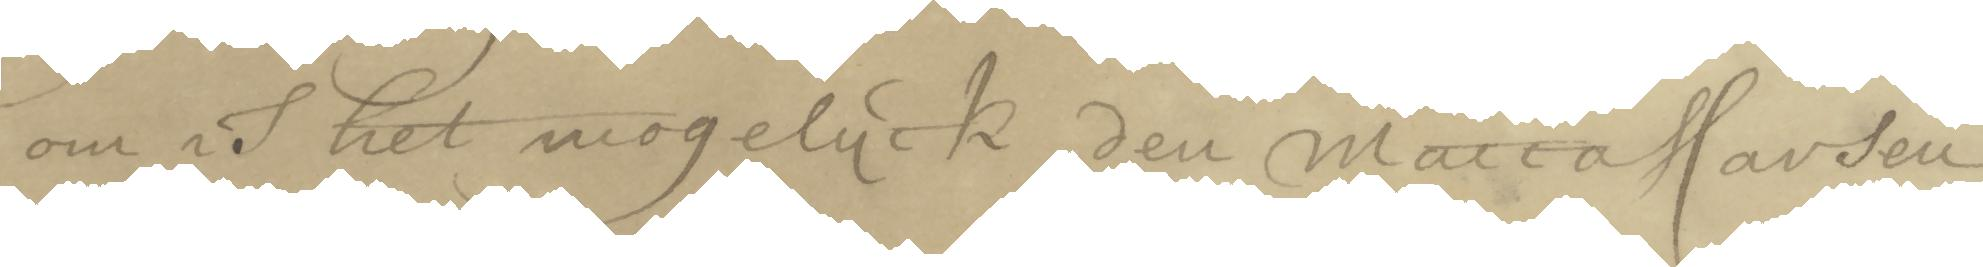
om is het mogelijck den maccassarsen
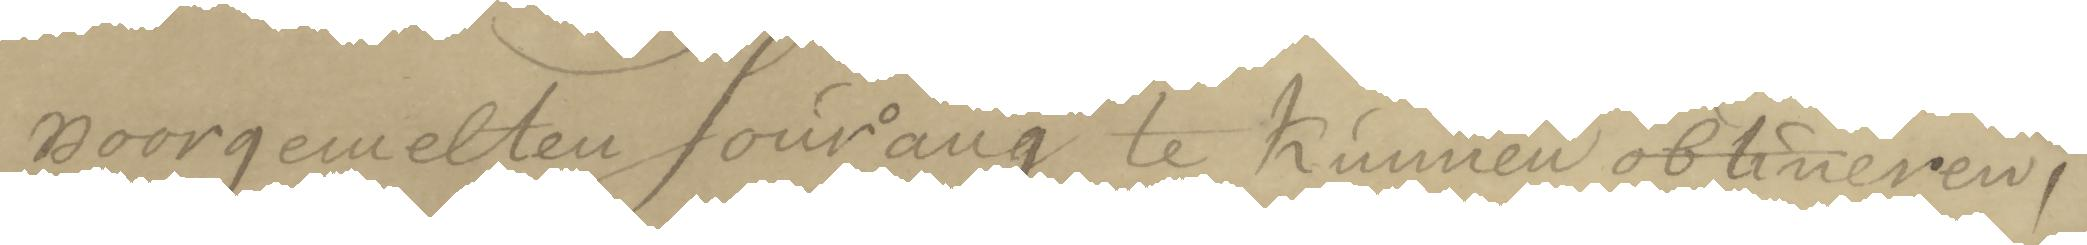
voor gemelten souroang te kunnen obtineren,
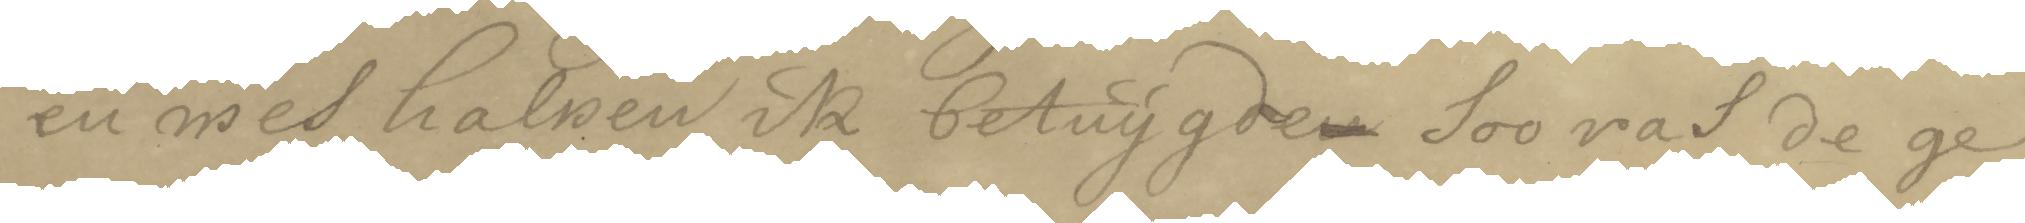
en wes halven ik betuijgden soo ras de ge
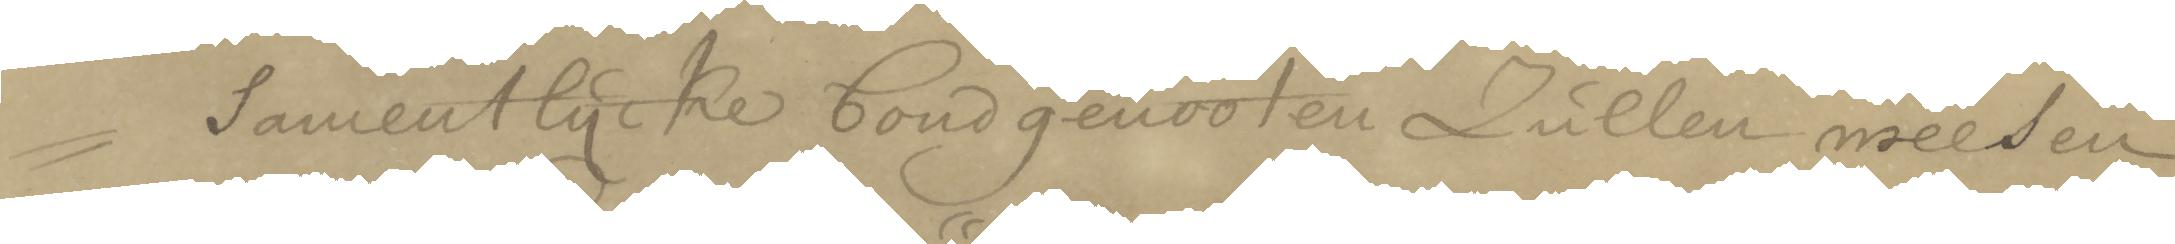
=samentlijcke bondgenooten zullen weesen
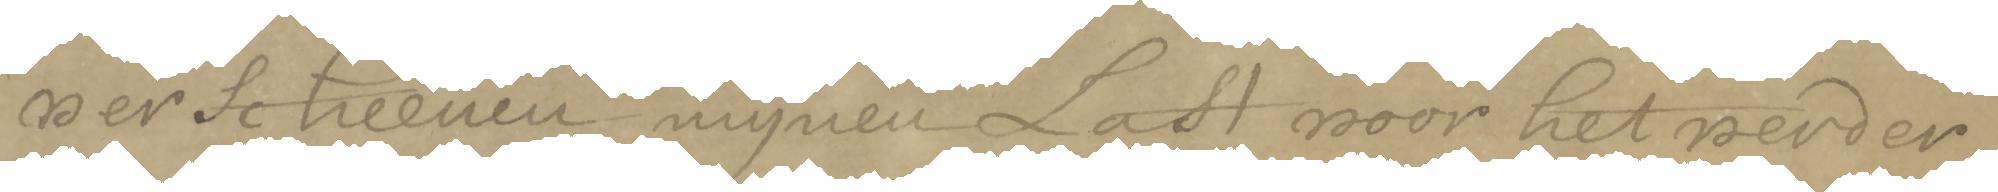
verscheenen mijnen Last voor het verder
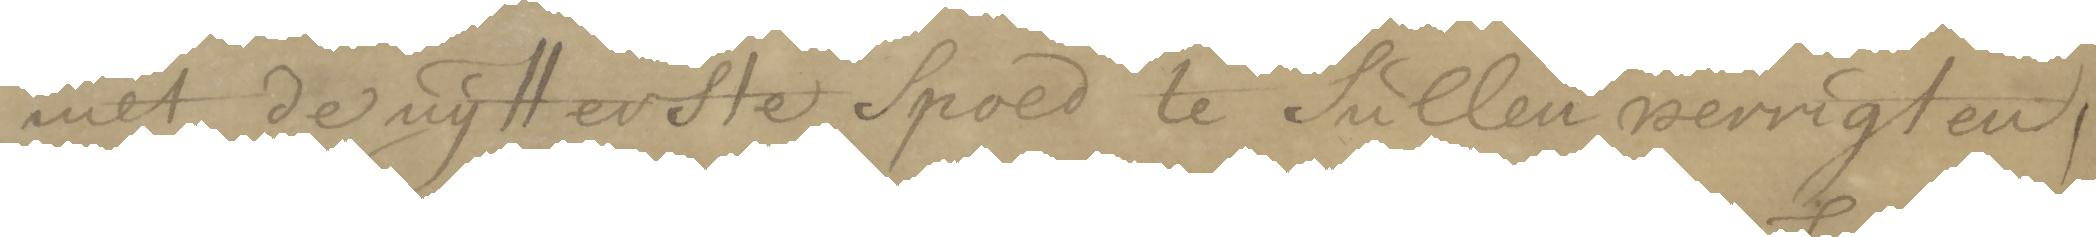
met de uijtterste spoed te sullen verrigten,
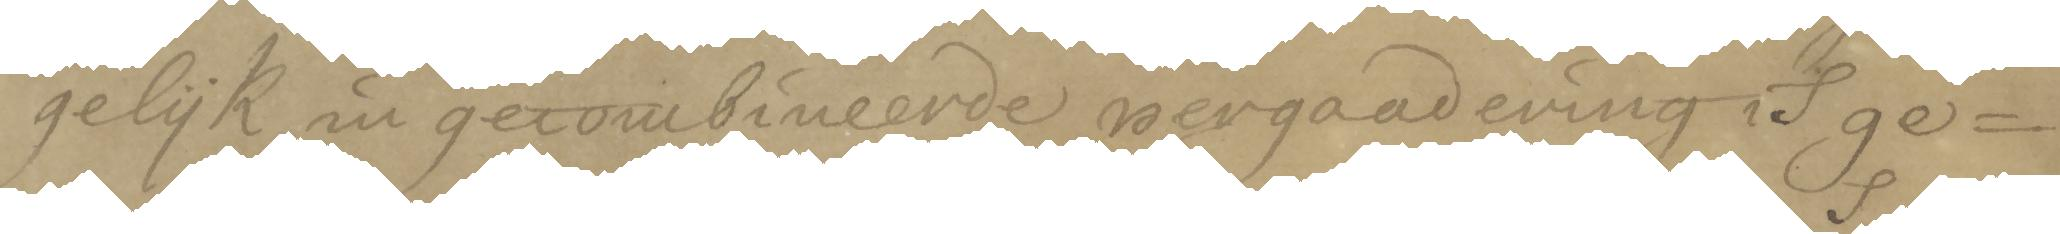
gelijk in gecombineerde vergaadering is ge=
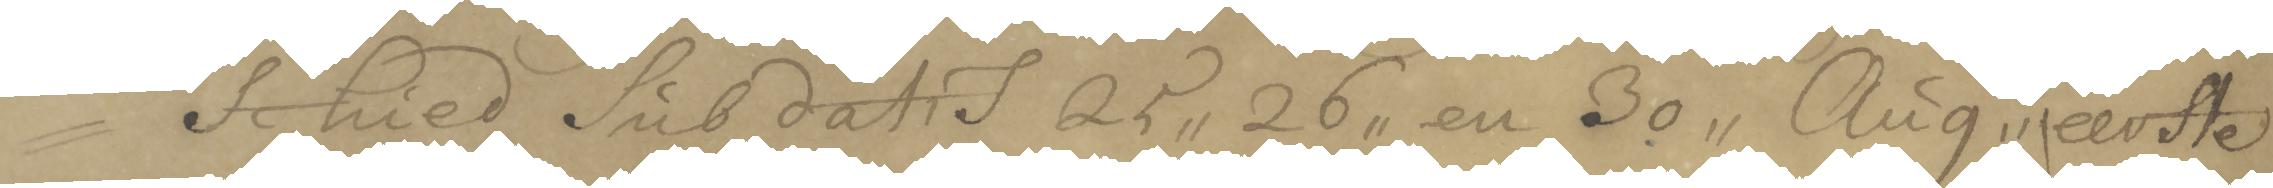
=schied sub datis 25„ 26„ en 30„ Aug„s, eerste
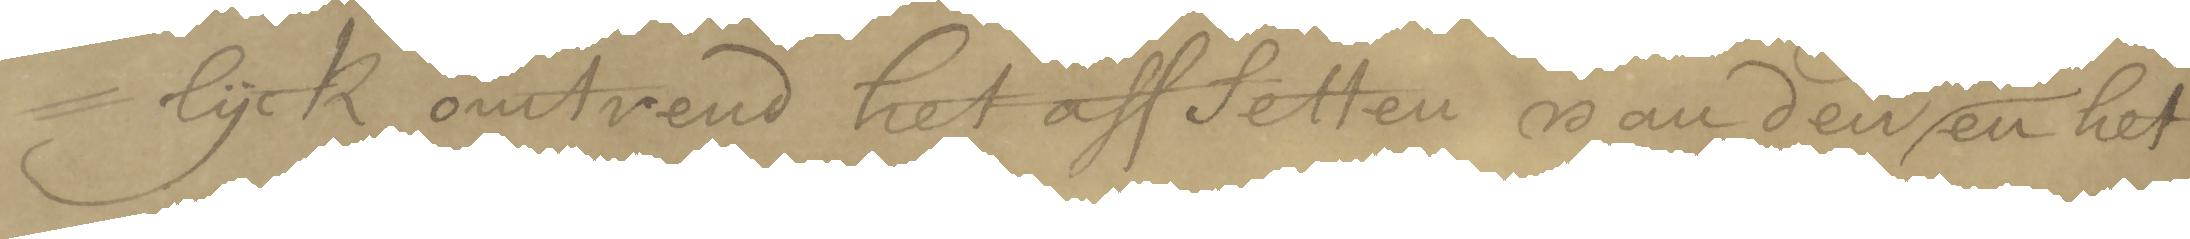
=lijck omtrend het affsetten van den ouden en het
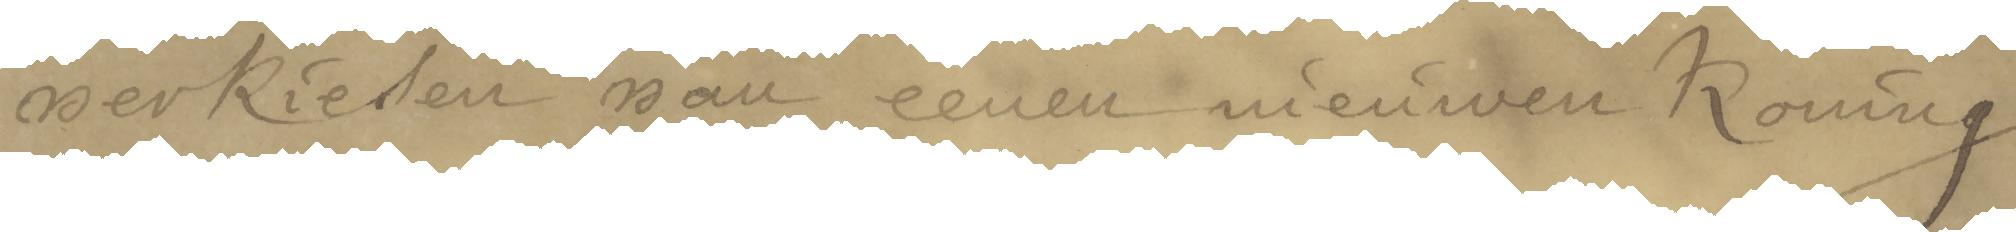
verkiesen van eenen nieuwen koning
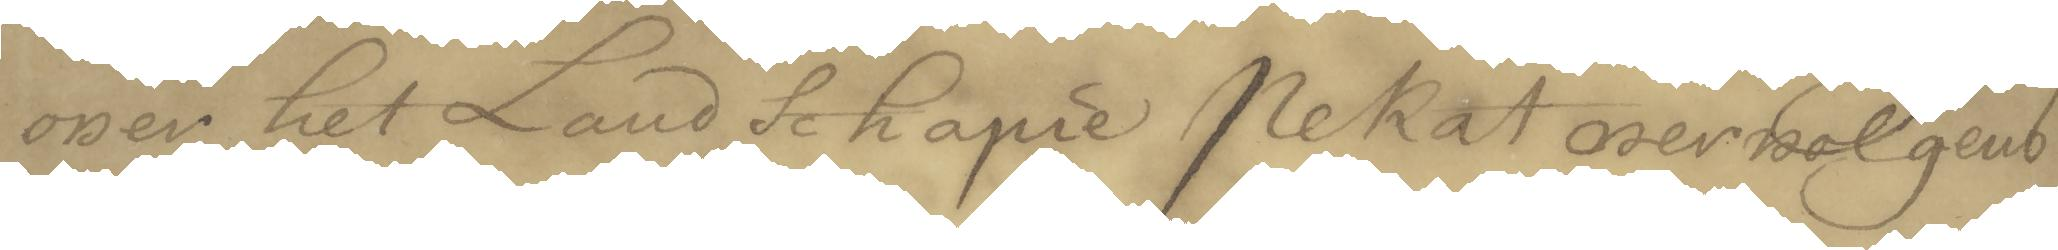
over het Land schapie pekat vervolgens
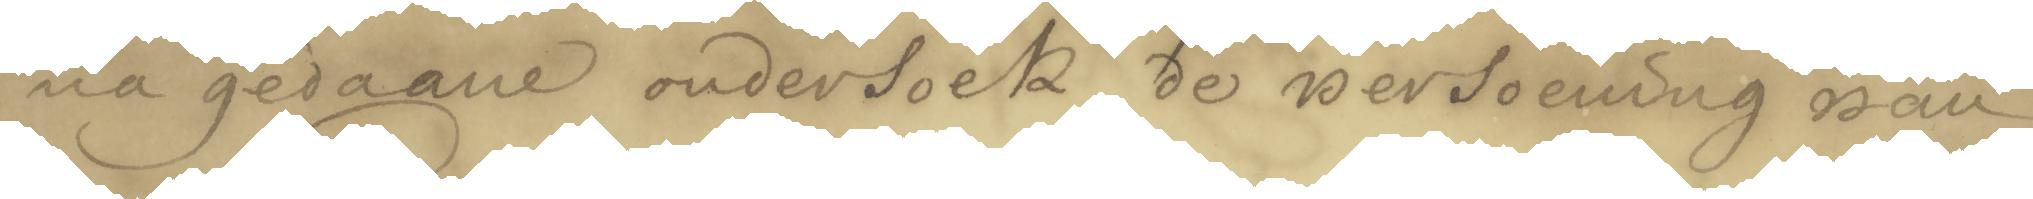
na gedaane ondersoek de versoening van
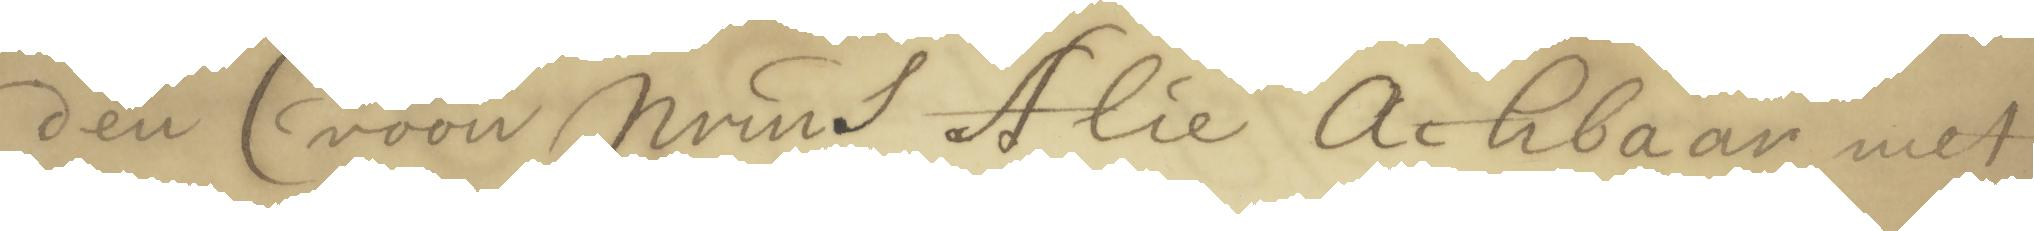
den Croon prins Alie Achbaar met
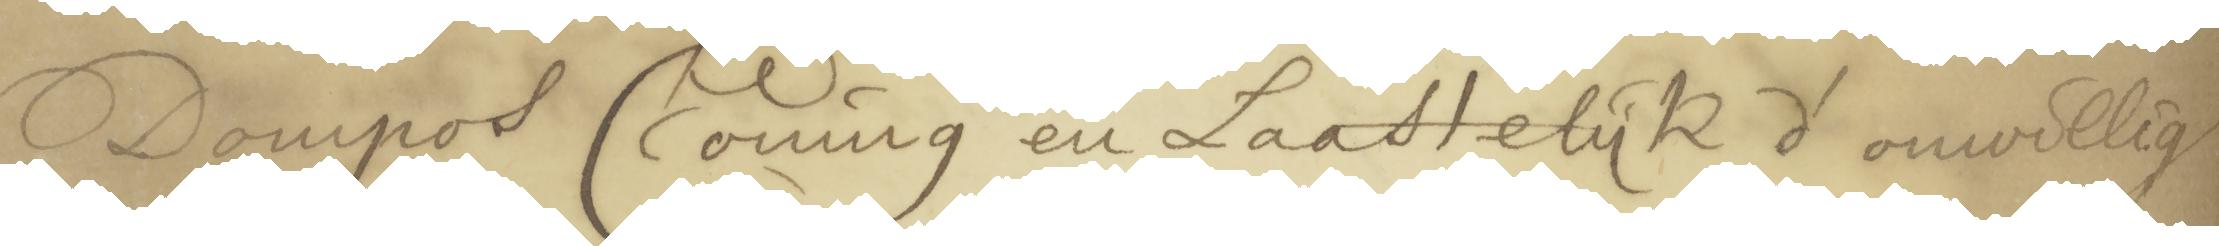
Dompos Coning en Laastelijk d' onwillig
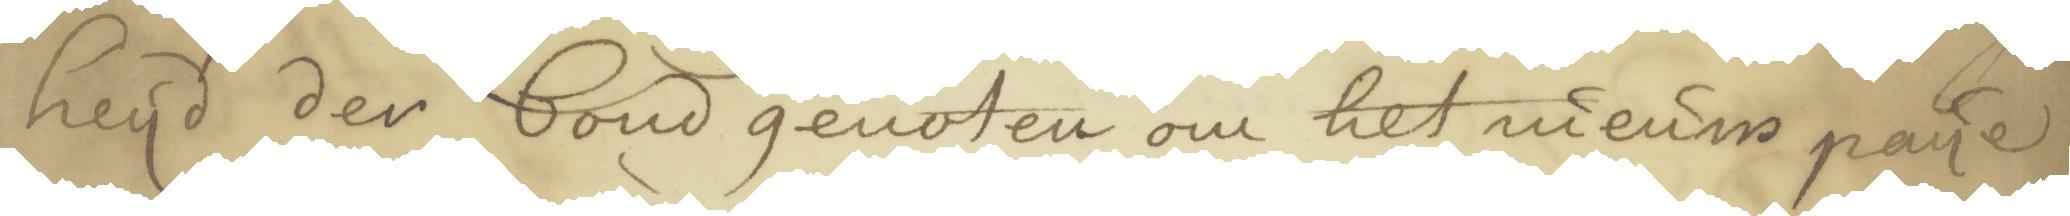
heijd der bond genoten om het nieuw paije
